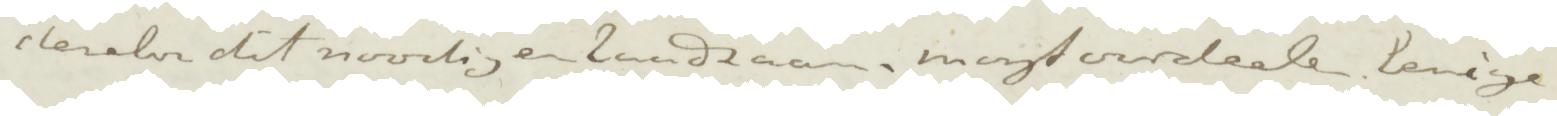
dezelve dit noodig en raadzaam mogt oordeelen Eenige
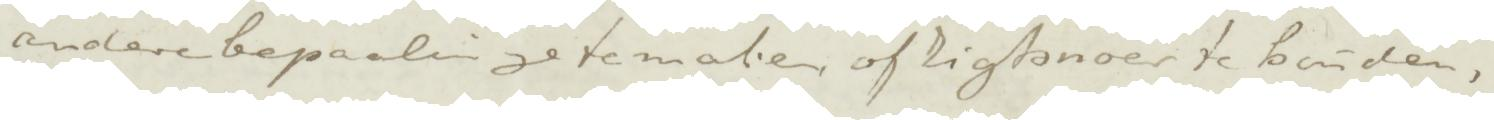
andere bepaalinge te maken, of rigtsnoer te houden,
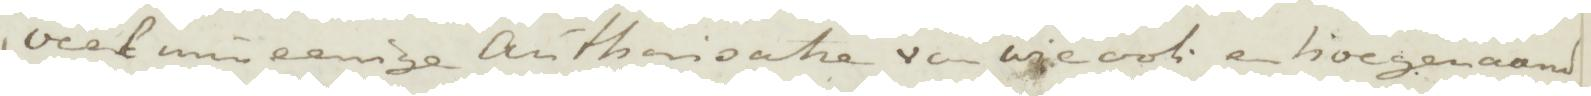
(veel min eenige Authorisatie van wie ook en hoegenaamd
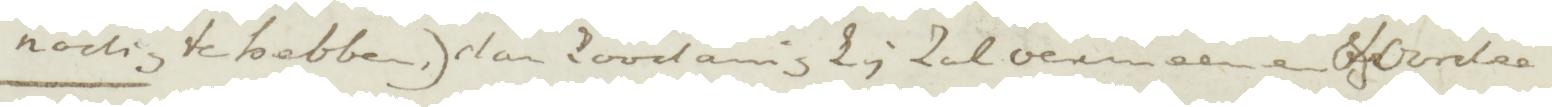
nodig te hebben,) dan zoodanig zij zal vermeenen & Oordee
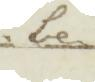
len
